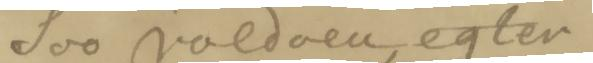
soo voldoen, egter
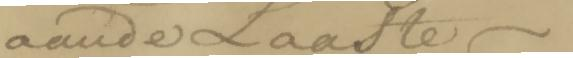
aande Laaste —
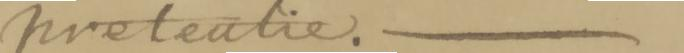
pretentie. —
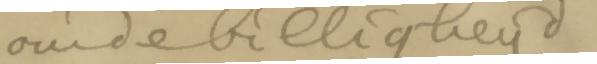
om de billigheijd
